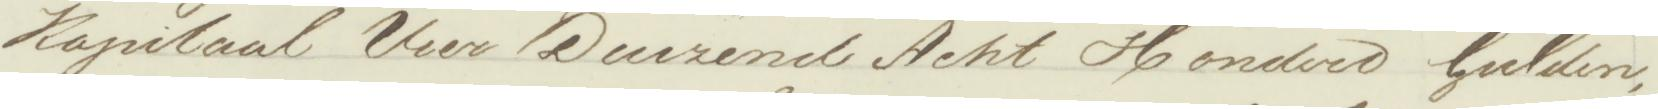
Kapitaal Vier Duizend Acht Honderd Gulden,
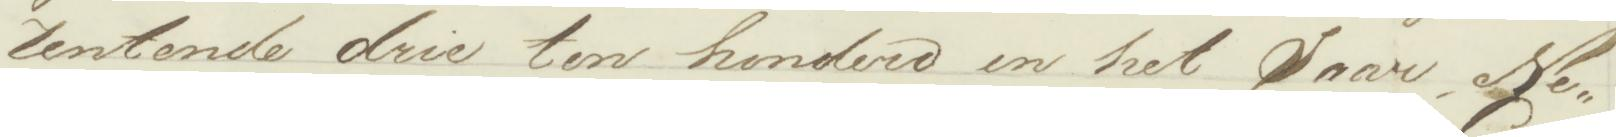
rentende drie ten honderd en het Iaar Ne„
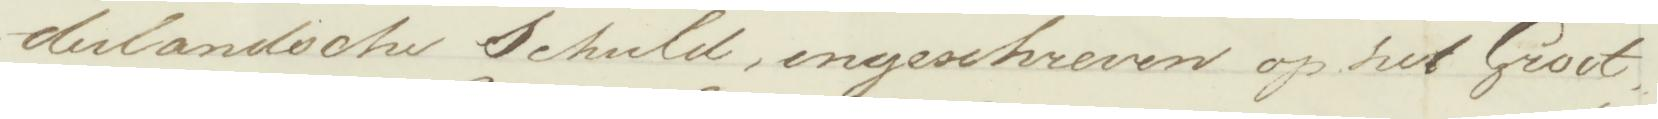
derlandsche Schuld, ingeschreven op het Groot„
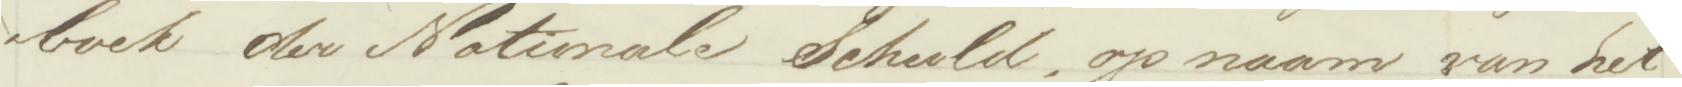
„boek der Nationale schuld, op naam van het
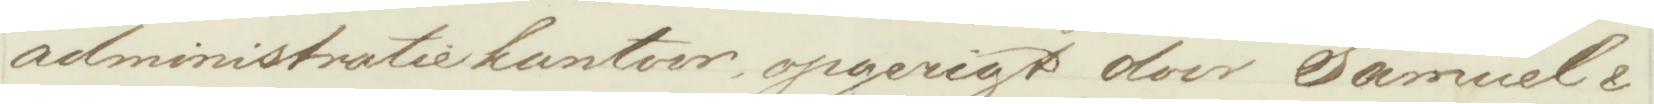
administratie kantoor, opgerigt door Samuel &
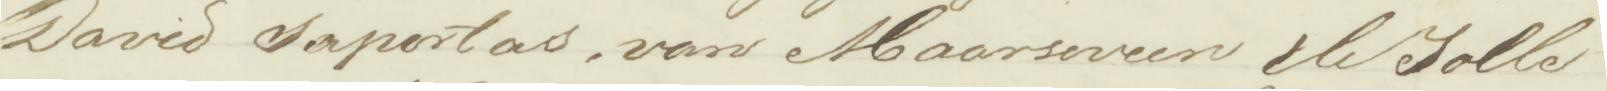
David Saportas, van Maarseveen & le Jolle
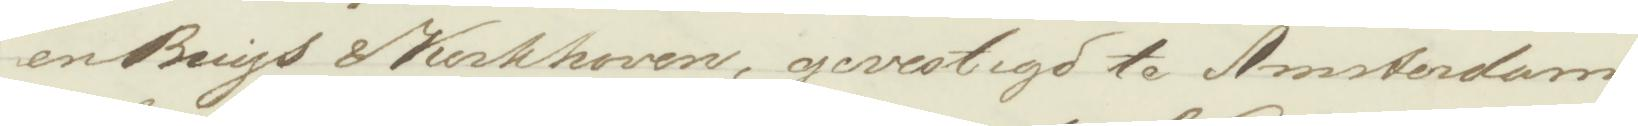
en Buijs & Kerkhoven, gevestigd te Amsterdam,
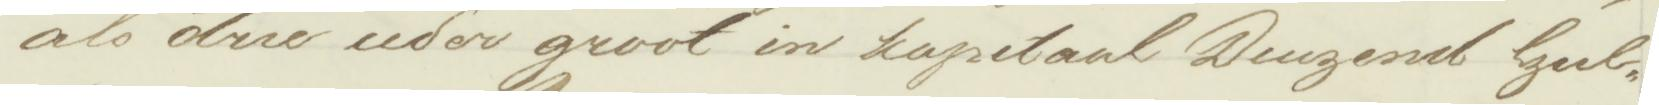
als drie ieder groot in kapitaal Duizend Gul„
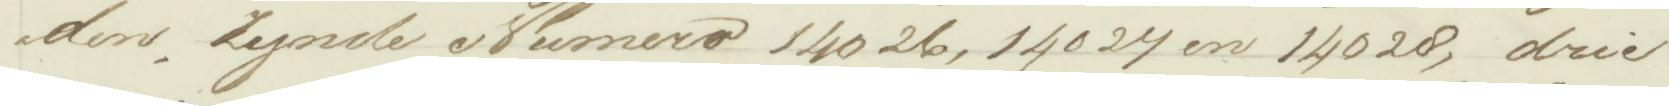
den, zynde Numero 14026, 14027 en 14028, drie
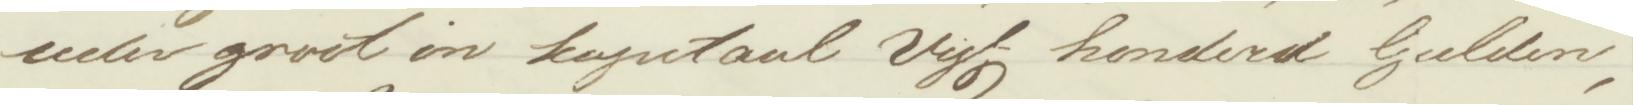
ieder groot in kapitaal vijf honderd Gulden,
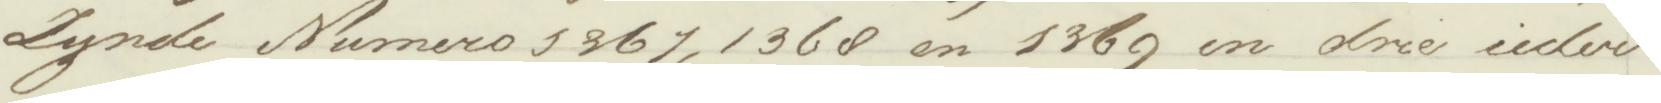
zynde Numero 1367, 1368 en 1369 in drie ieder
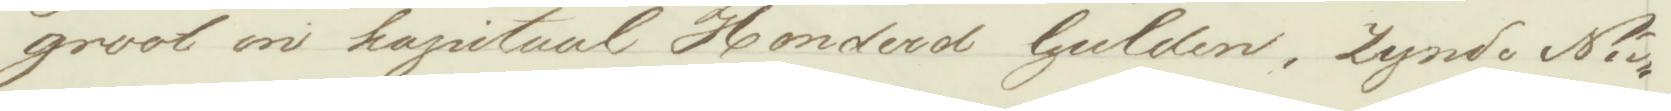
groot in kapitaal Honderd Gulden, zynde Nu„
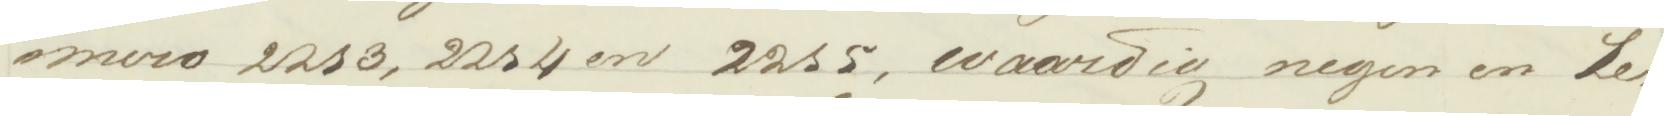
mero 2213, 2214 en 2215, waardig negen en ze
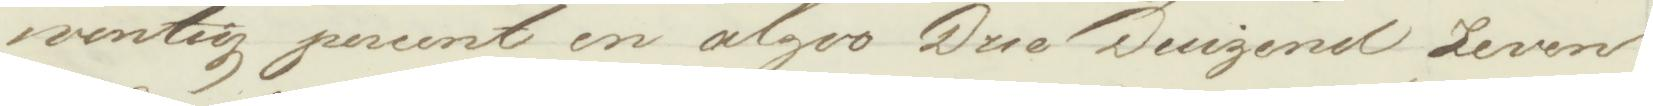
,ventig percent en alzoo Drie Duizend zeven
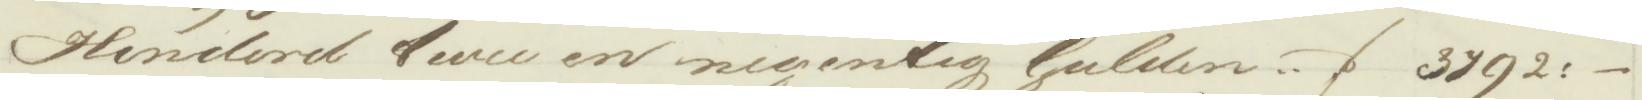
Honderd twee en negentig Gulden. . ƒ 3792: —
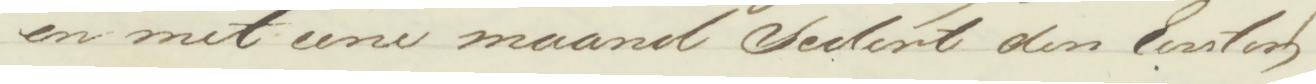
en met eene maand Sedert den Eersten
